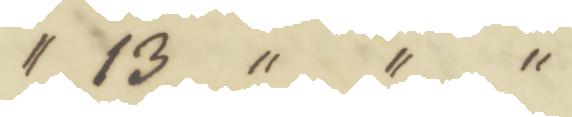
„ 13 „ „ „
